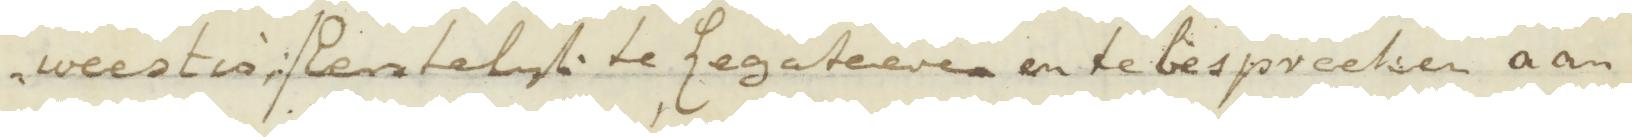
=weest is:/ Eerstelijk te Legateeren en te bespreeken aan
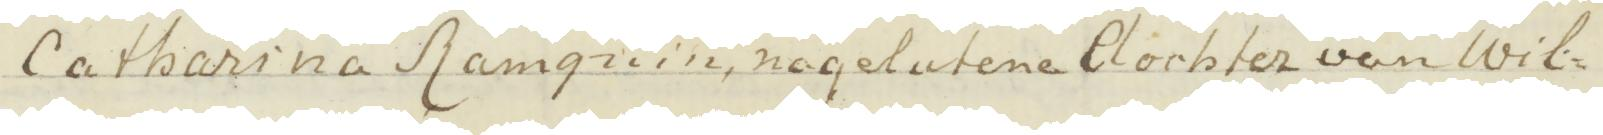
Catharina Ramquin, nagelatene Dochter van Wil=
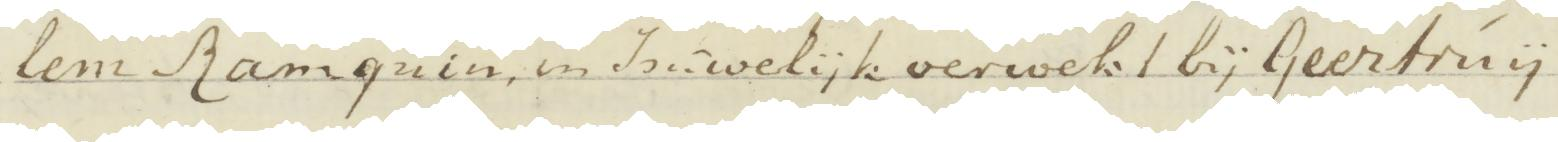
lem Ramquin, in huwelijk verwekt bij Geertruij
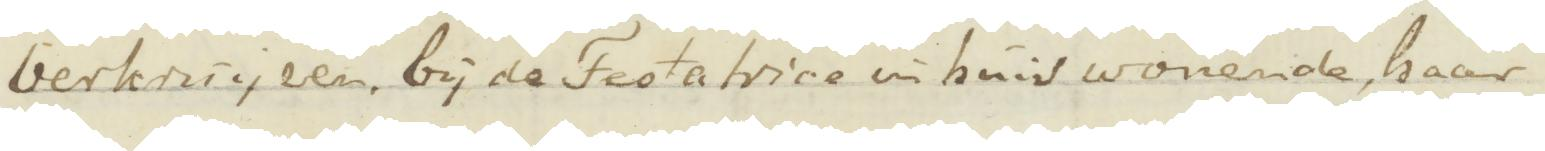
verkruizen, bij de Testatrice in huis wonende, haar
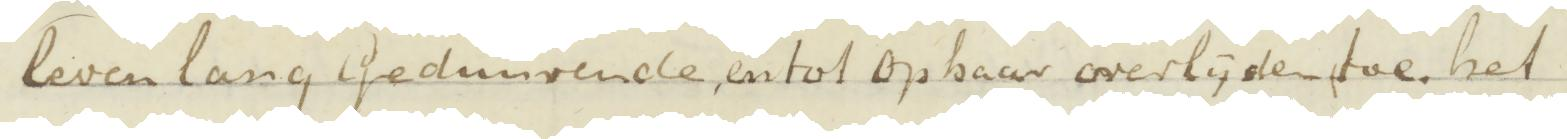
leven lang Geduurende, en tot op haar overlijden toe, het
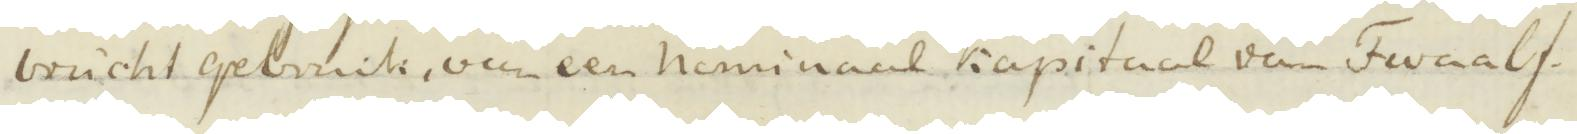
vrucht gebruik, van een nominaal kapitaal van Twaalf-
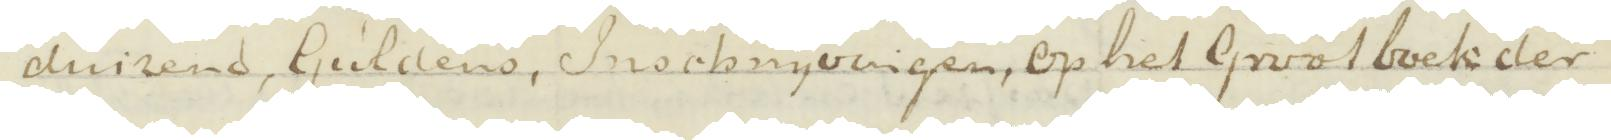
duizend, Guldens, Jnschrijvingen, op het groot boek der
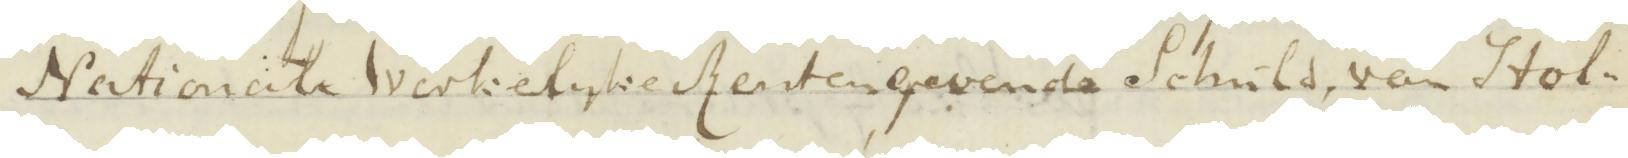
Nationale Werkelyke Renten gevende Schuld, van Hol=
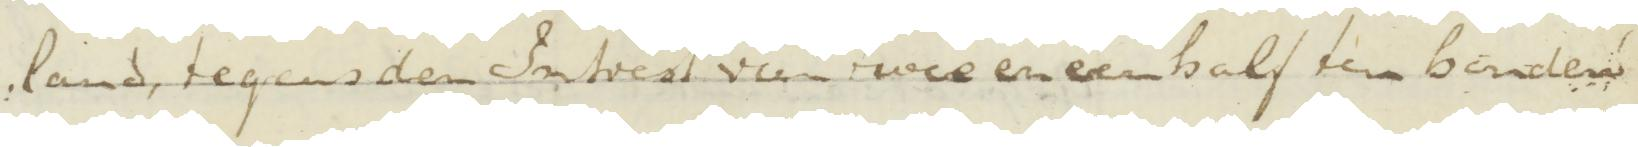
=land, tegens den Jntrest van twee en een half tien honderd
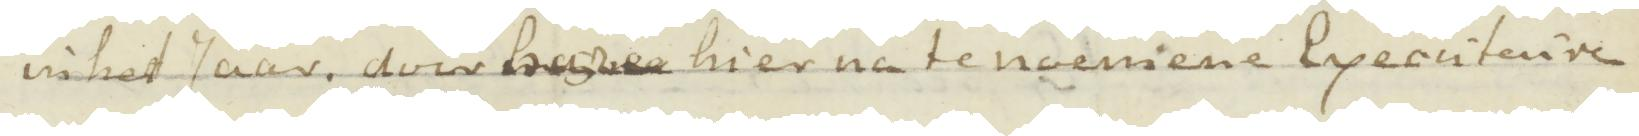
in het Jaar door hiever hier na te noemene Executeure
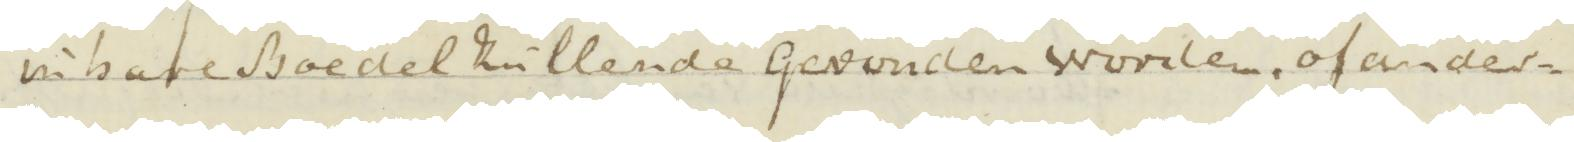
in hare Boedel zullende Gevonden worden, of ander=
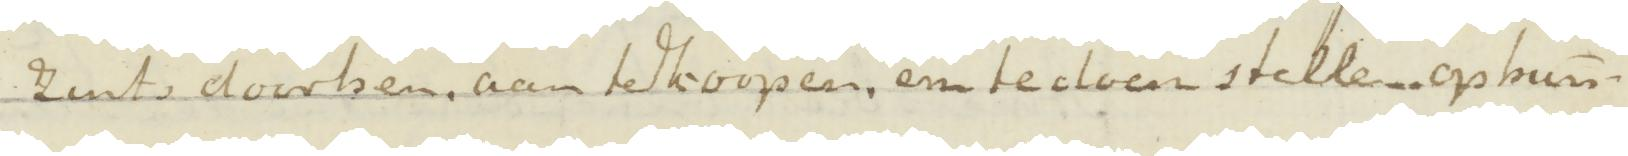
zints door hen, aan te koopen, en te doen stellen op hun-
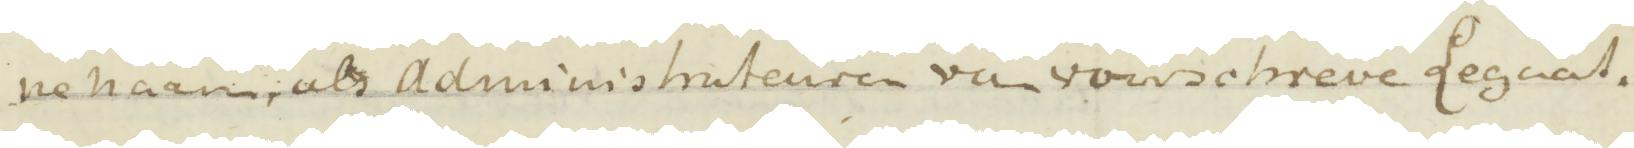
ne naam, als administrateuren van voorschreve Legaat.
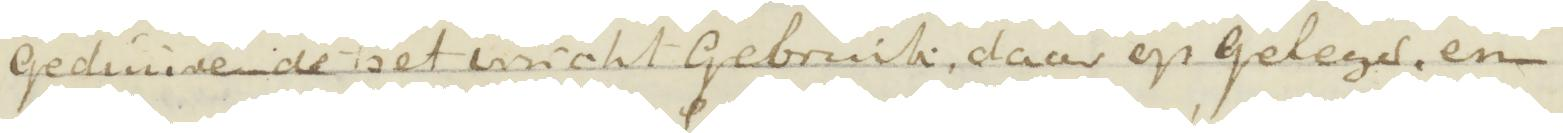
Geduurende het vrucht Gebruik, daar op gelegd, en
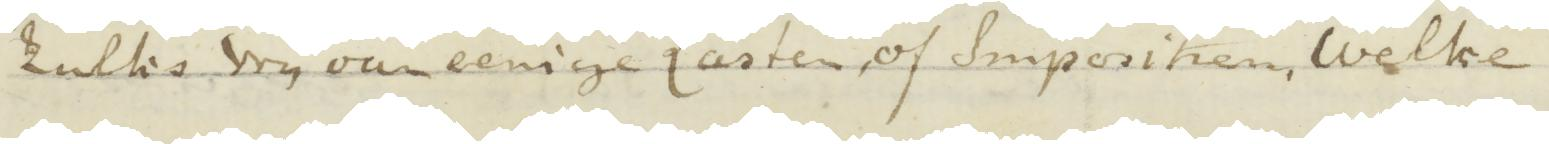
zulks wij van eenige Lasten, of Jmperitien, welke
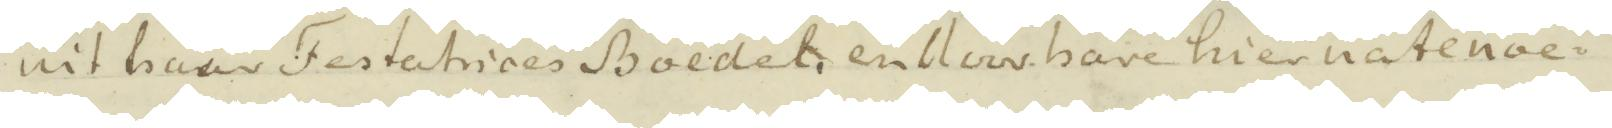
uit haar Testatrices Boedel, en door hare hier natenoe=
